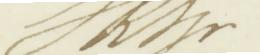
IKSjr
